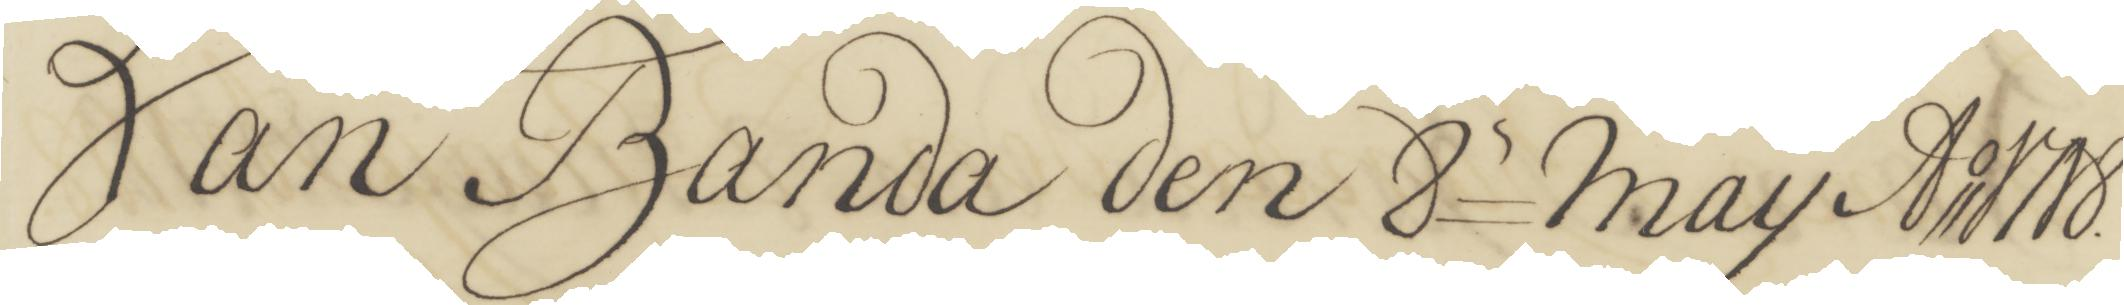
Van Banda den 8=' Maij A„o 1718.
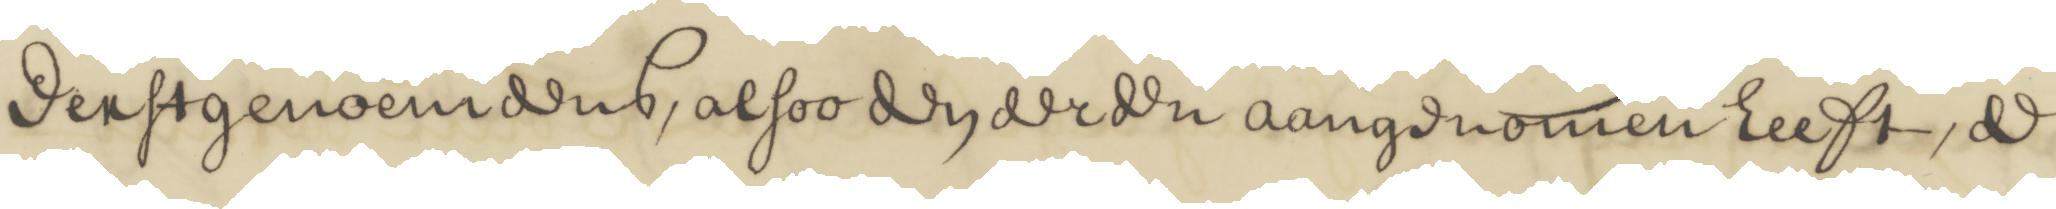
Eerst genoemdens, alsoo den derden aangenomen heeft, de
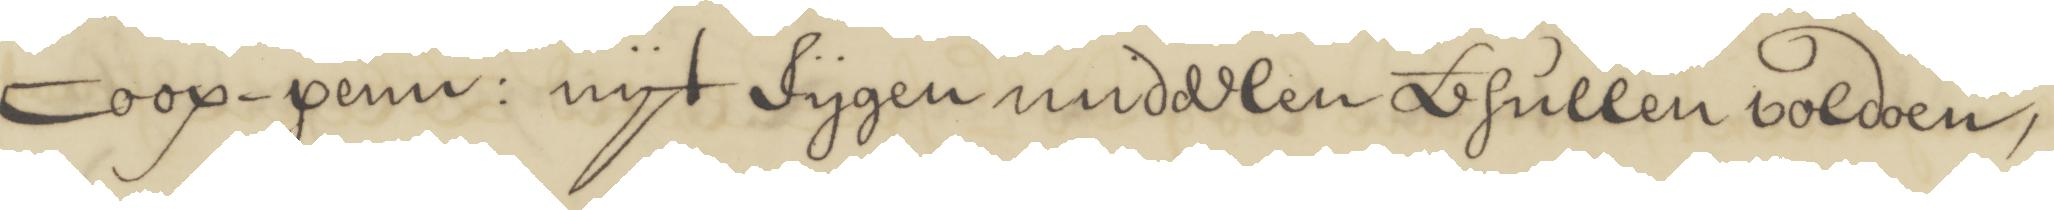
coop-penn: uijt Eijgen middelen te sullen voldoen,
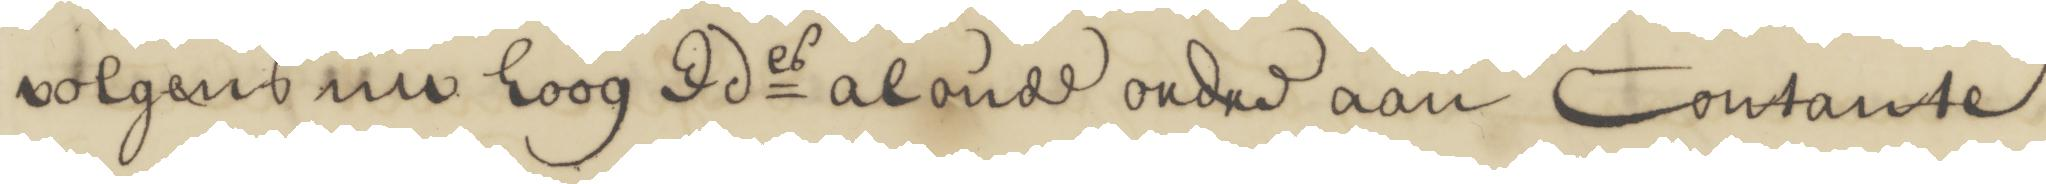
volgens uw hoog Ed=ls al oude ordre aan contante
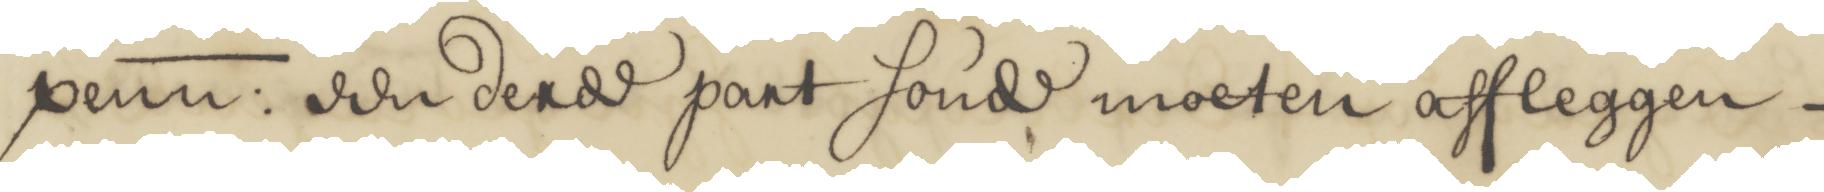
penn: een derde part soude moeten affleggen
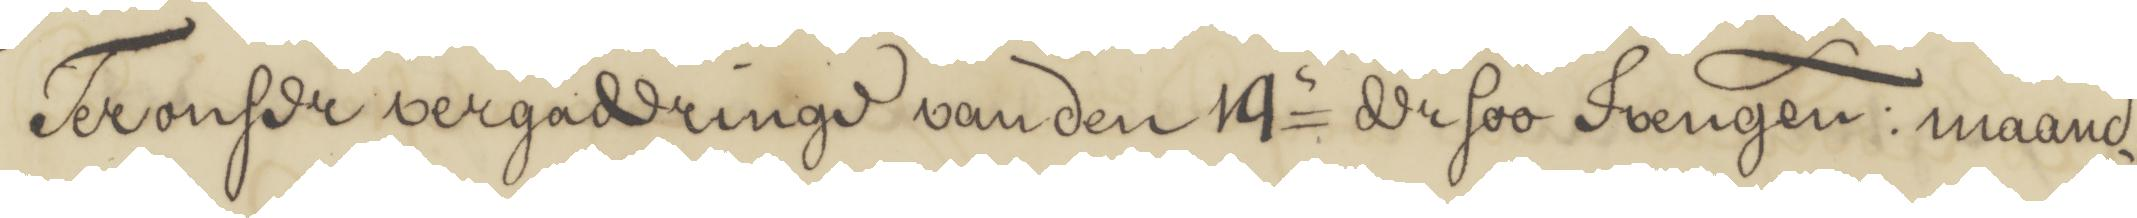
Ter onser vergaderinge van den 14=' der soo Evengen: maand
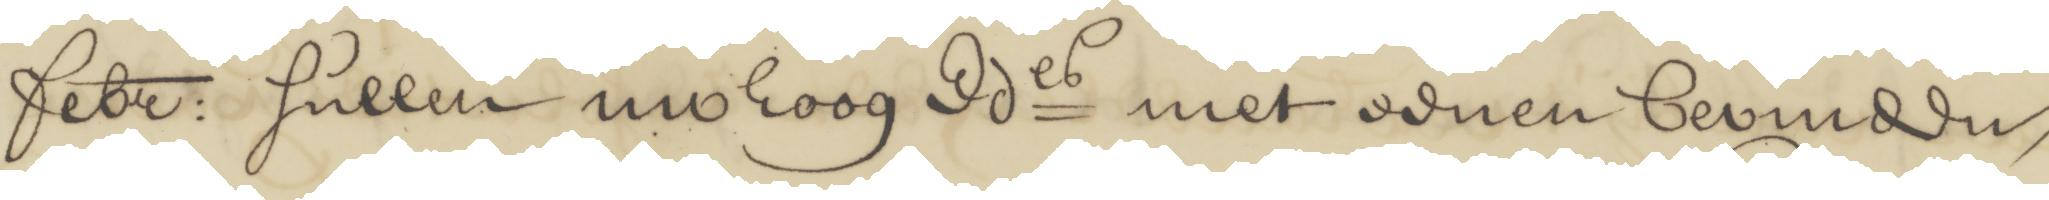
febr: sullen uw hoog Ed=ls met eenen bevinden,
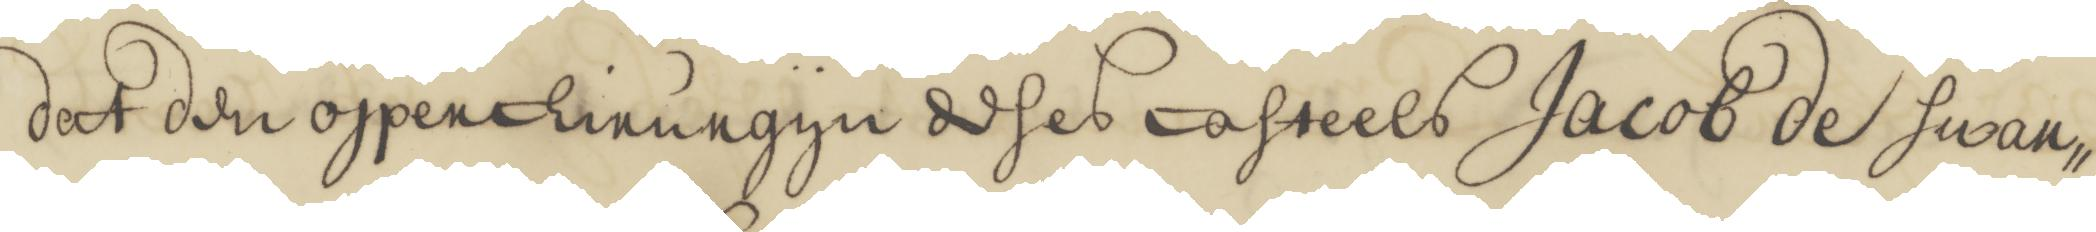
dat den opperchirurgijn deses casteels Jacob de swar„
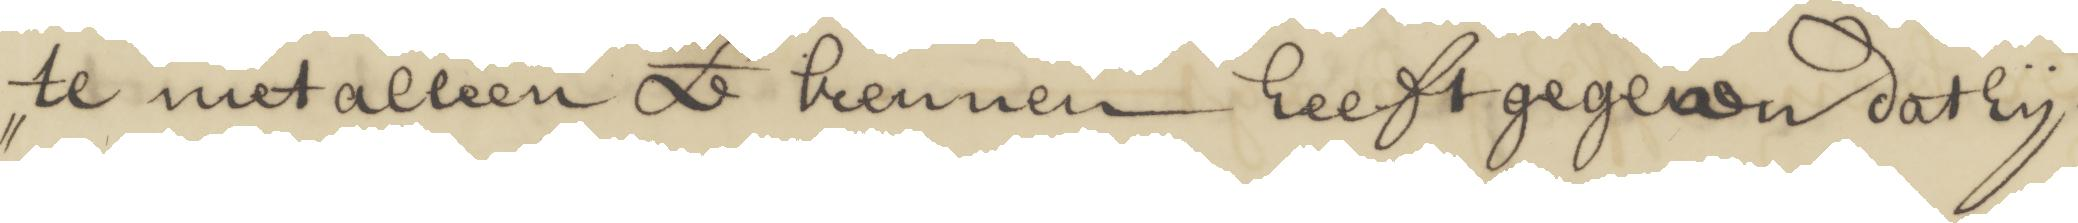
„te niet alleen te kennen heeft gegeven dat hij
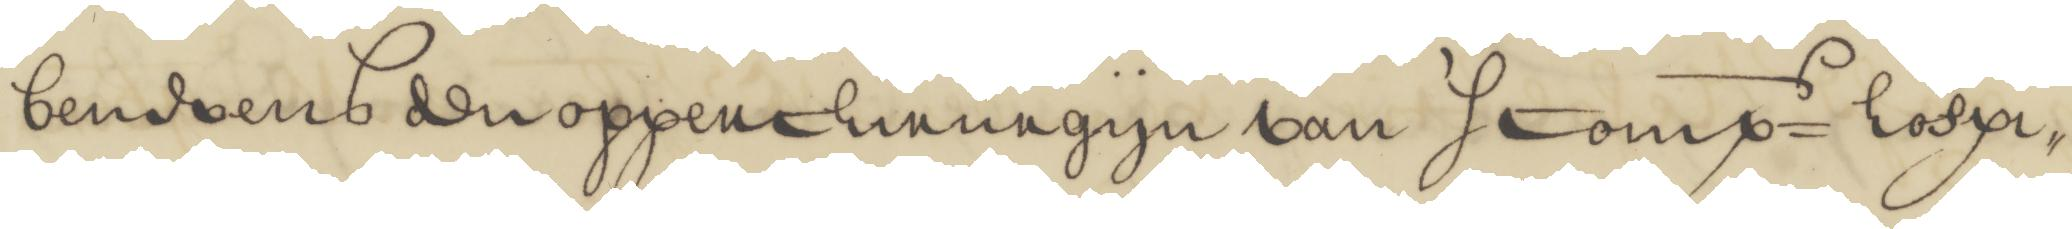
benevens den opperchirurgijn van 's comp=s hospi„
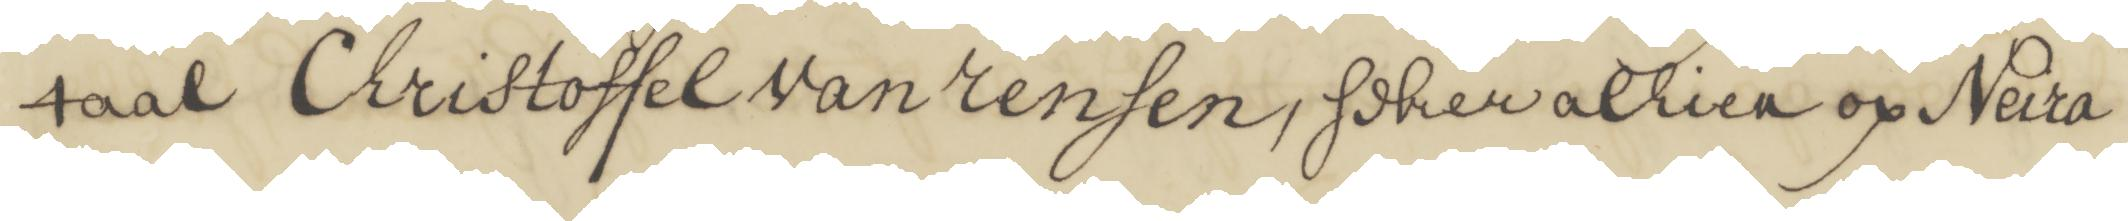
taal Christoffel van rensen, seker alhier op Neira
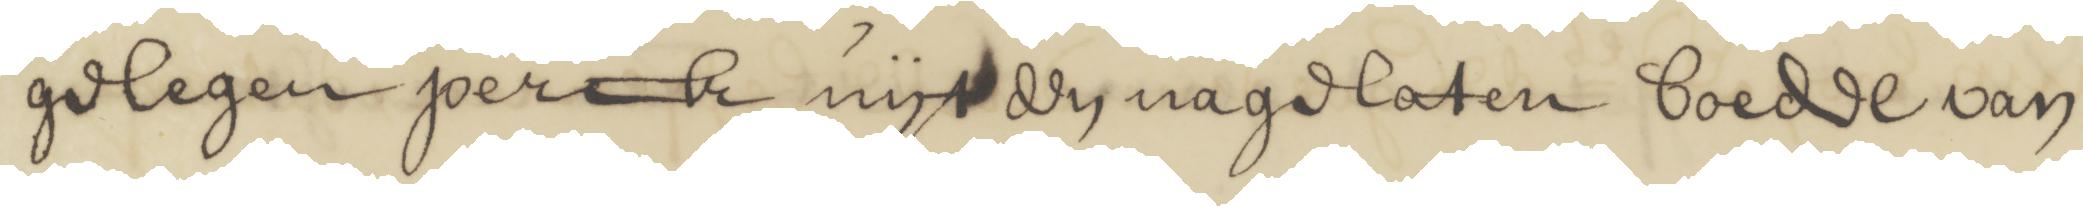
gelegen perck uijt den nagelaten boedel van
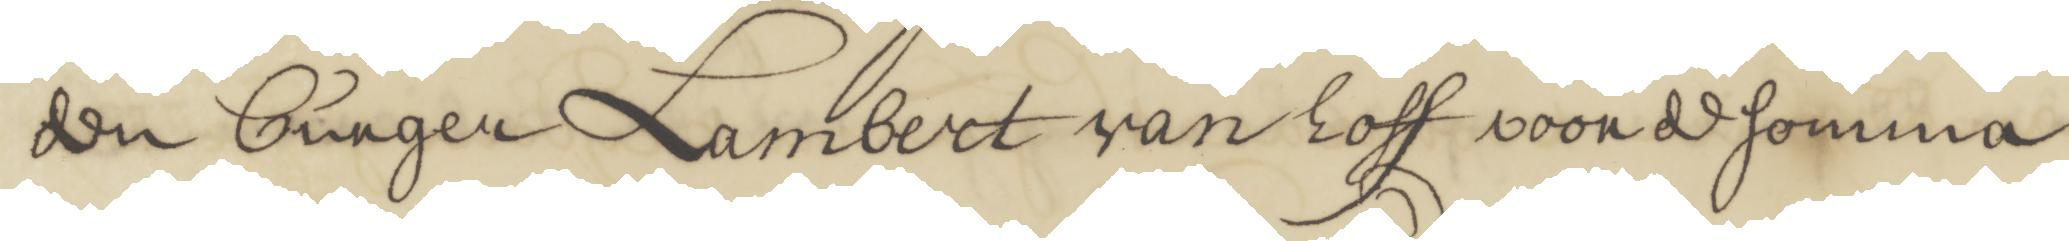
den burger Lambert van hoff voor de somma
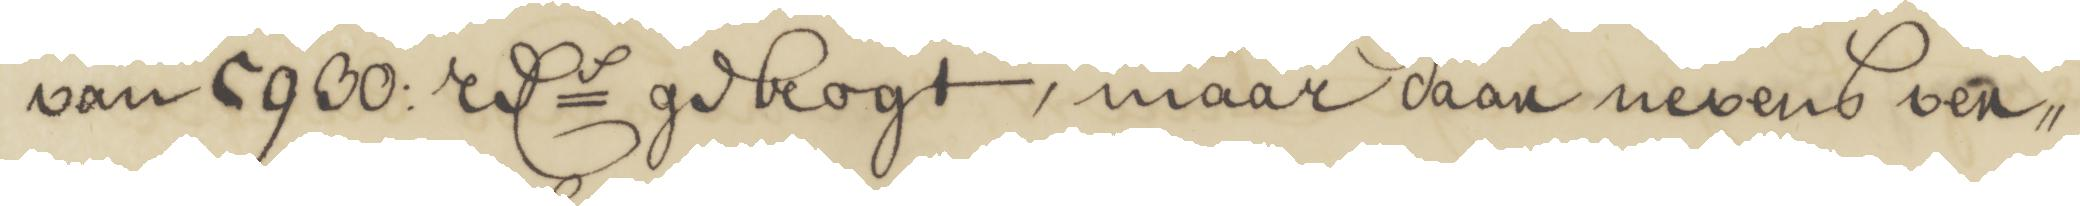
van 5930: rd=s gekogt, maar daar nevens ver„
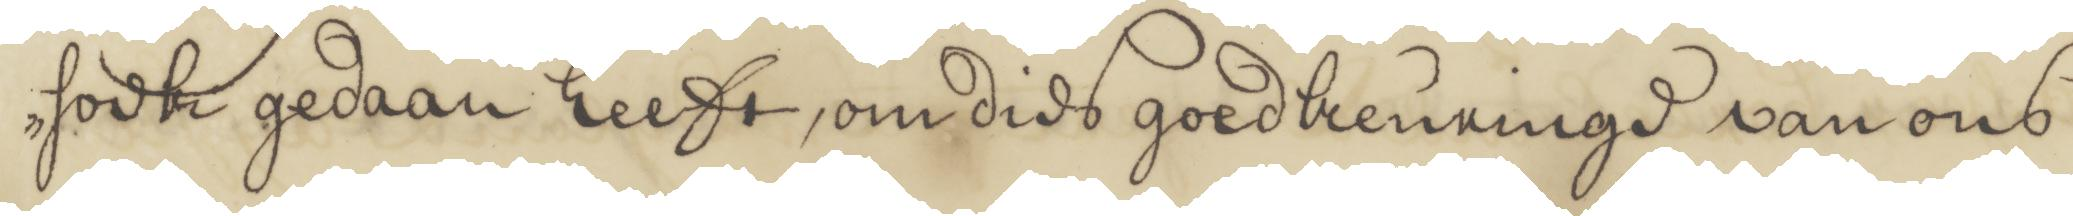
„soek gedaan heeft, om dies goedkeuringe van ons
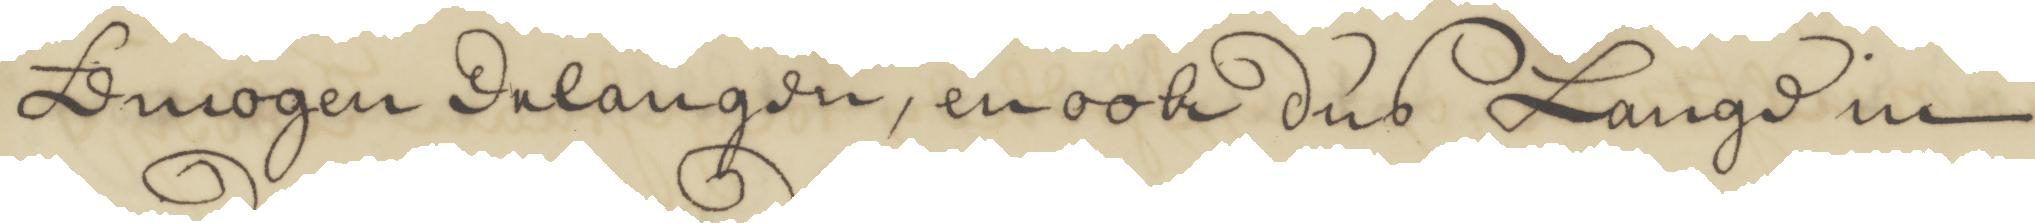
te mogen Erlangen, en ook dus Lange in
